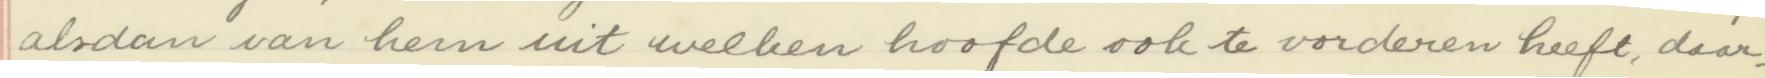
alsdan van hem uit welken hoofde ook te vorderen heeft, daar
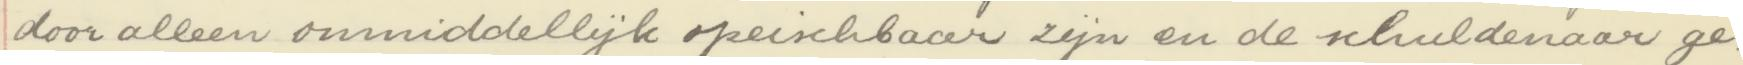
door alleen onmiddellijk opeischbaar zijn en de schuldenaar ge
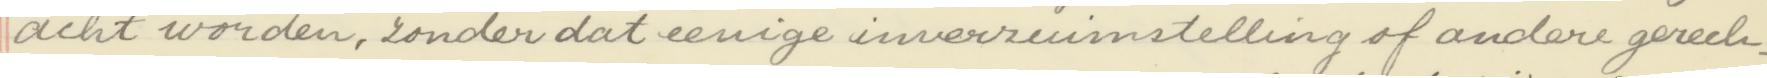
acht worden, zonder dat eenige inverzuimstelling of andere gerech
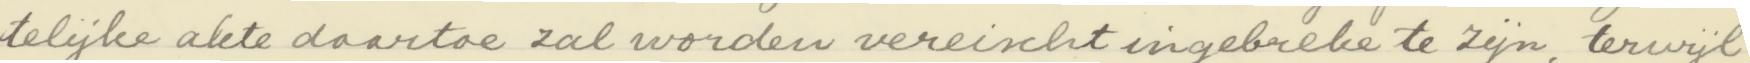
telijke akte daartoe zal worden vereischt ingebreke te zijn, terwijl
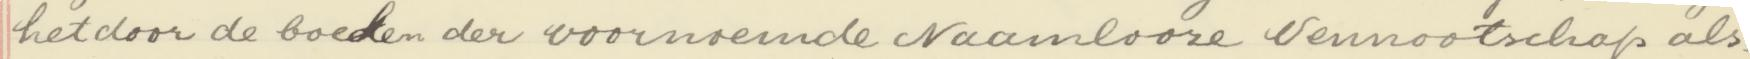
het door de boeken der voornoemde Naamlooze Vennootschap als
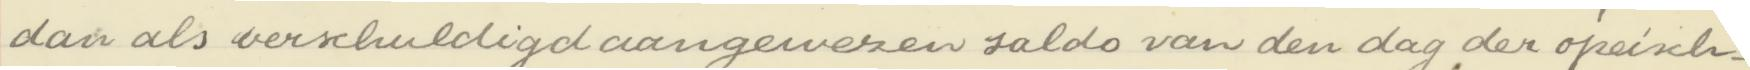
dan als vershuldigd aangewezen saldo van den dag der opeisch-
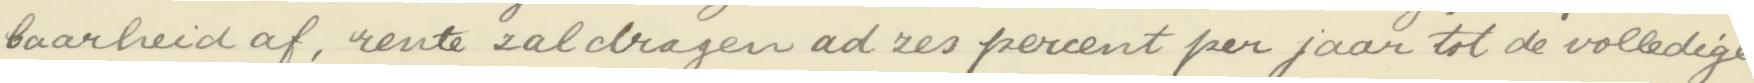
baarheid af, rente zal dragen ad zes percent per jaar tot de volledige
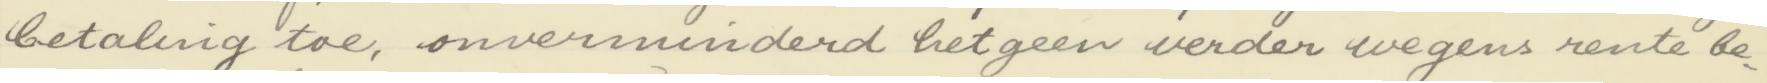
betaling toe, onverminderd hetgeen verder wegens rente be-
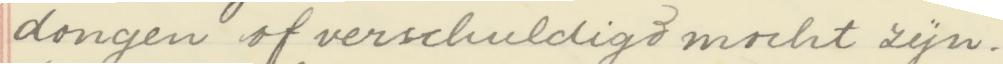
dongen of verschuldigd mocht zijn
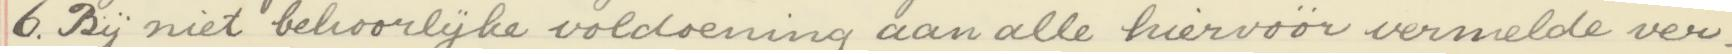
6. Bij niet behoorlijke voldoening aan alle hiervóór vermelde ver
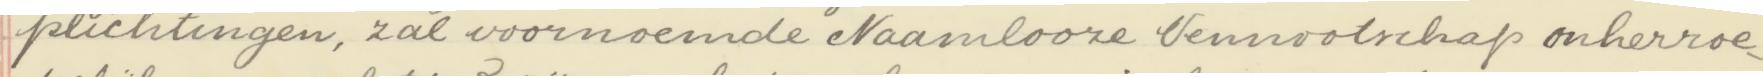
plichtingen, zal voornoemde Naamlooze Vennootschap onherroe-
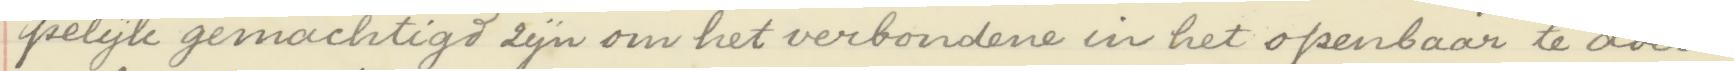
pelijk gemachtigd zijn om het verbondene in het openbaar te doen
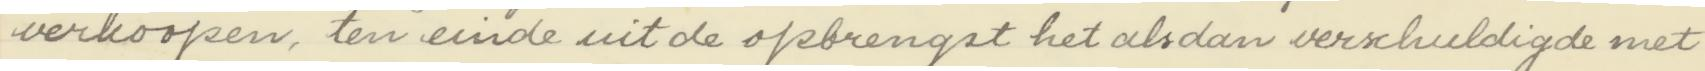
verkoopen, ten einde uit de opbrengst het als dan verschuldigde met
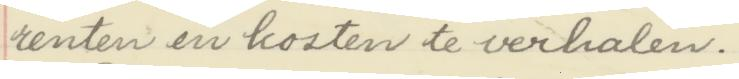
renten en kosten te verhalen.
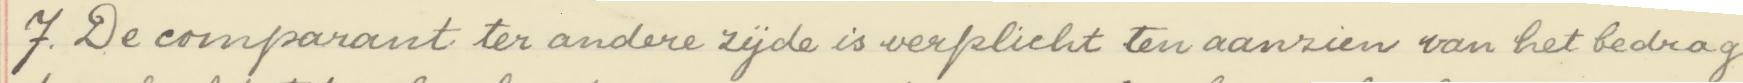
7. De comparant ter andere zijde is verplicht ten aanzien van het bedrag
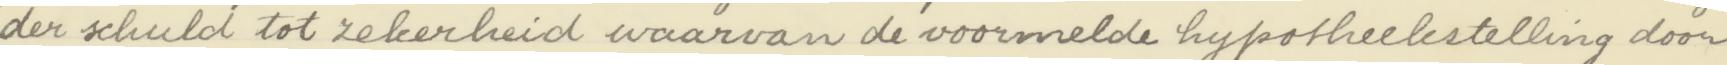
der schuld tot zekerheid waarvan de voormelde hypotheekstelling door
